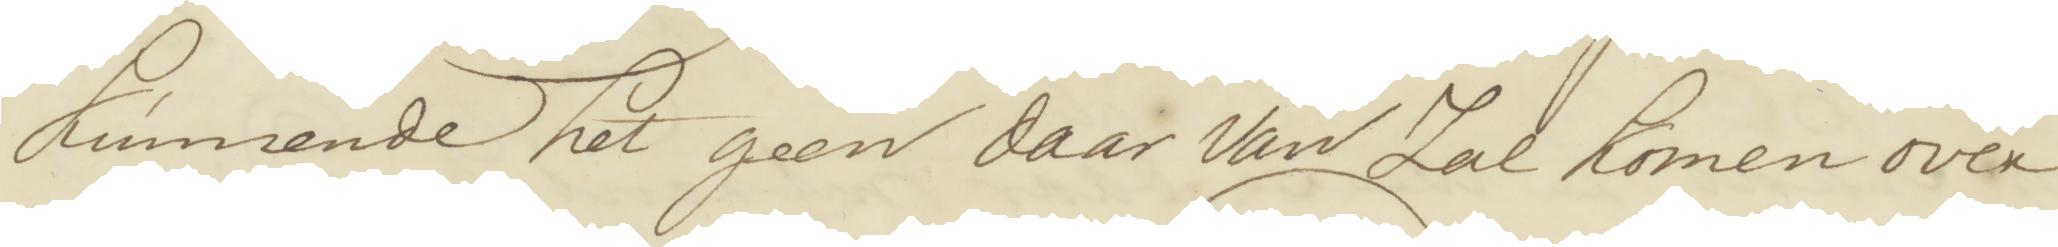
kunnende het geen daar van zal komen over
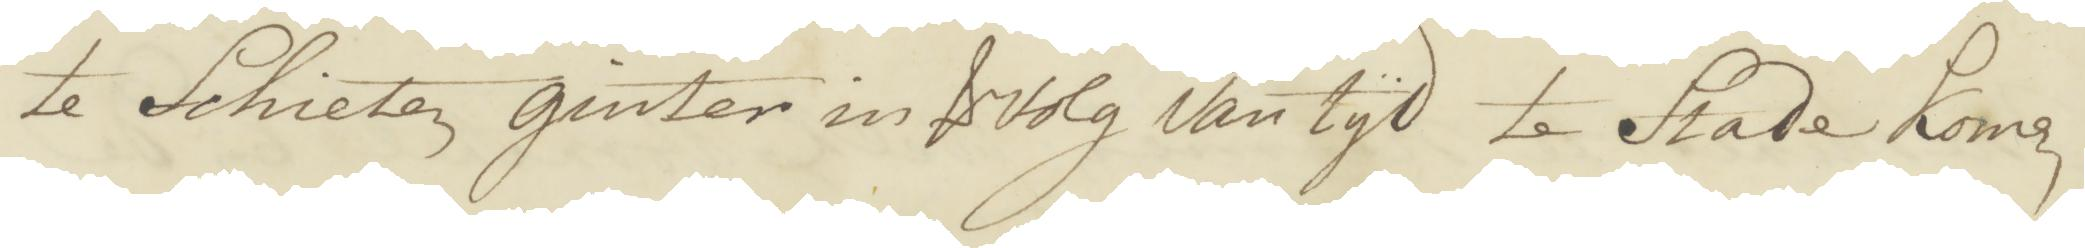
te schieten ginter in vervolg van tijd te stade komen
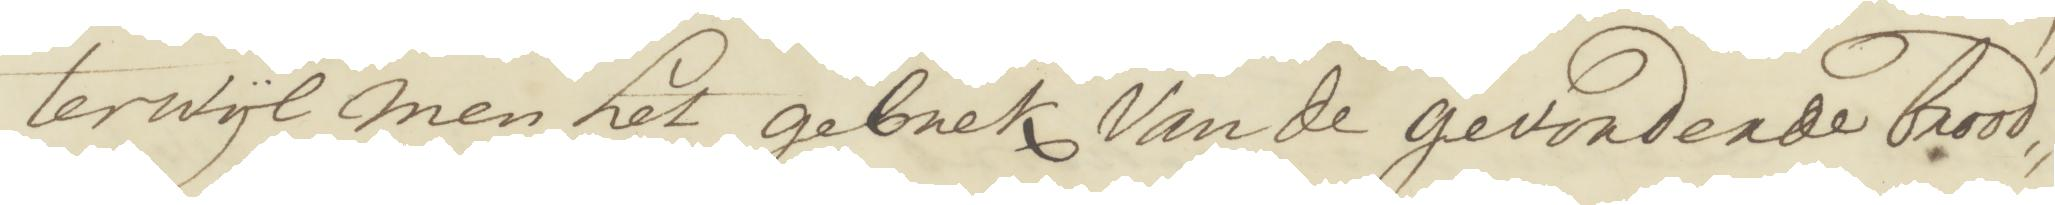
terwijl men het gebrek van de gevorderde brood„
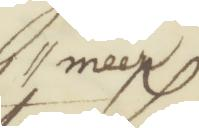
„ meer
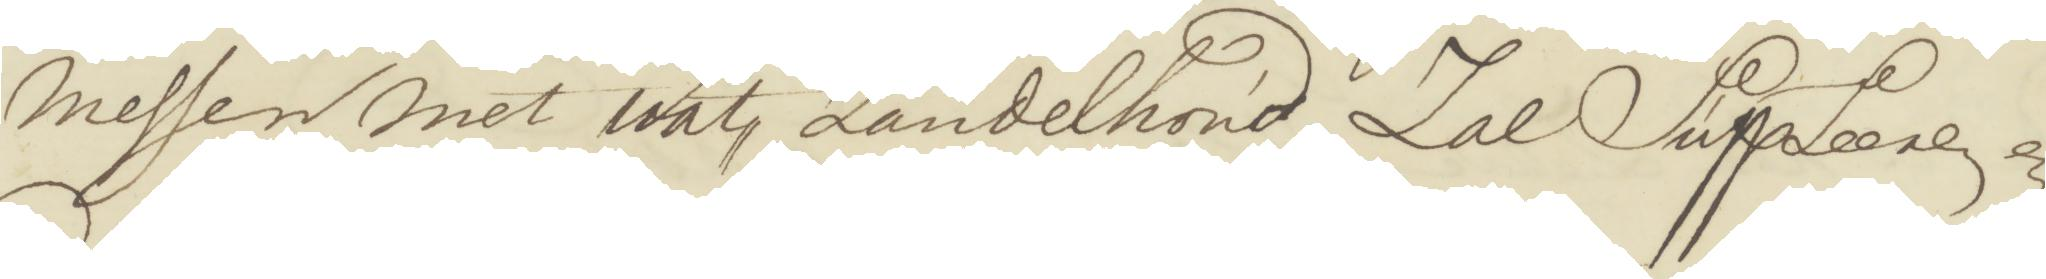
messen met wat„ zandelhoud zal suppleeren en
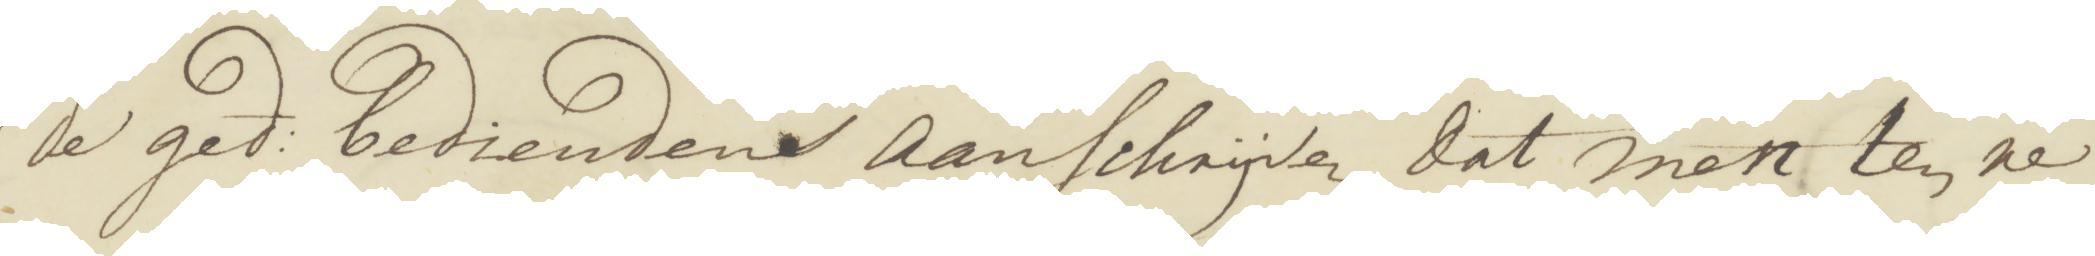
de ged: bediendens aanschrijven dat men ten re
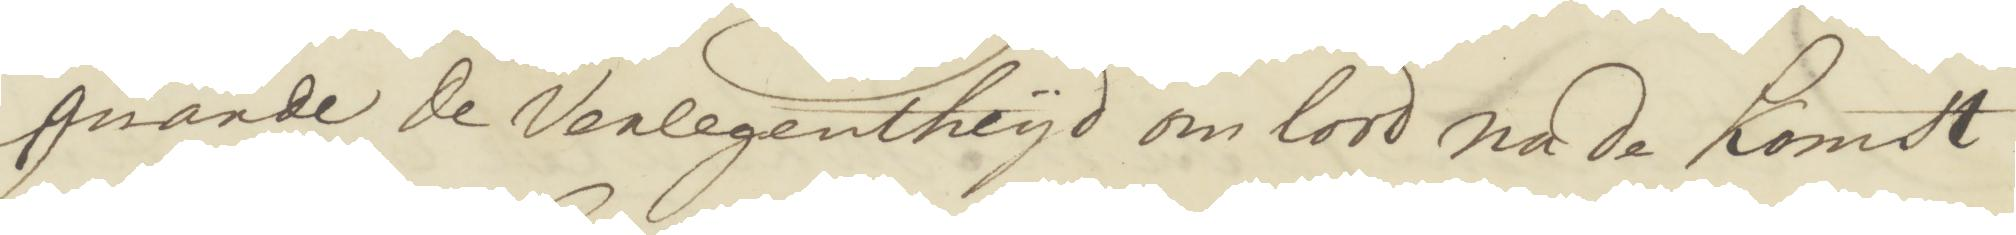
guarde de verlegentheijd om lood na de komst
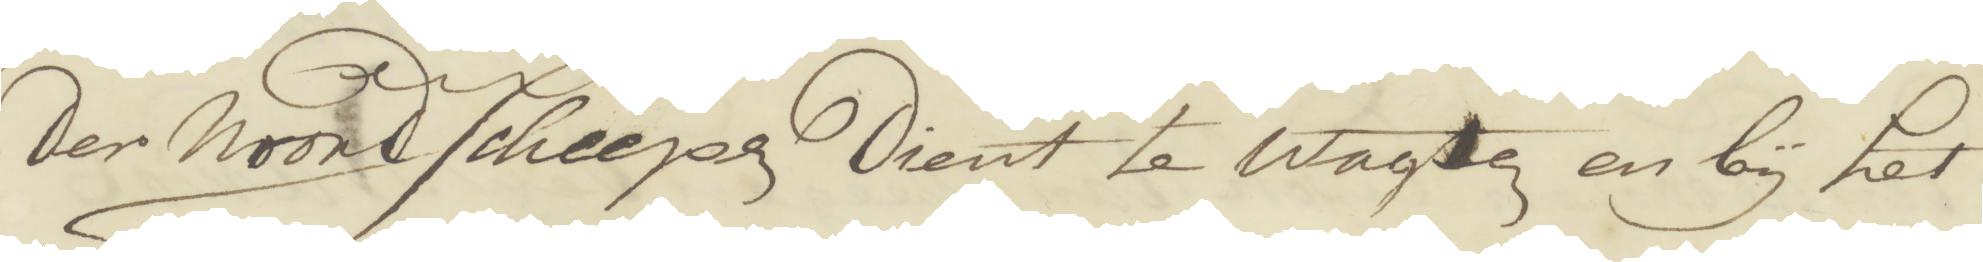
der noord scheepen dient te wagten en bij het
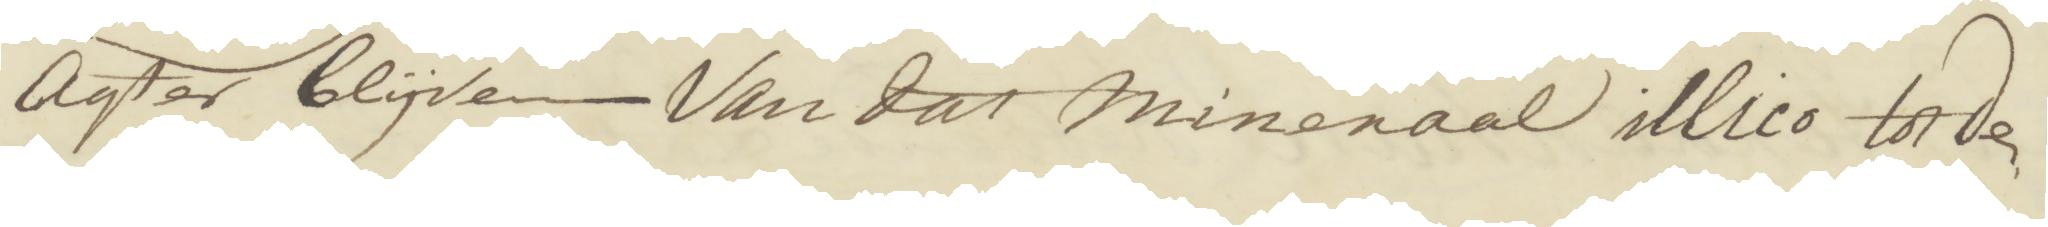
agter blijven van dat mineraal illico tot den
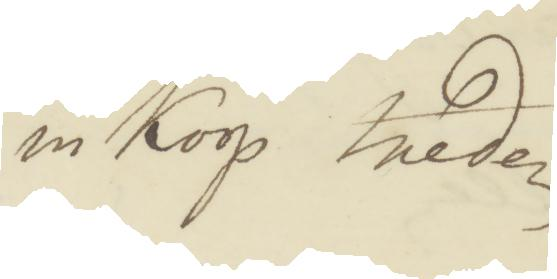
in koop treden
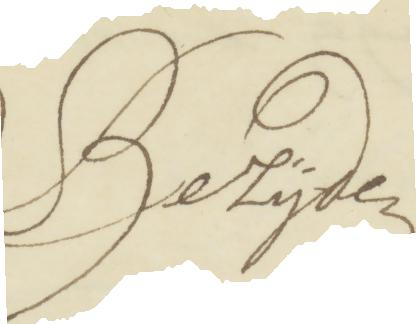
Bezijden
